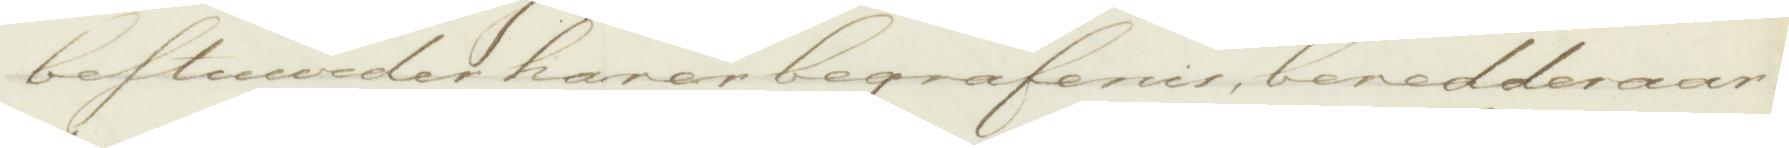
bestuurder harer begrafenis, beredderaar
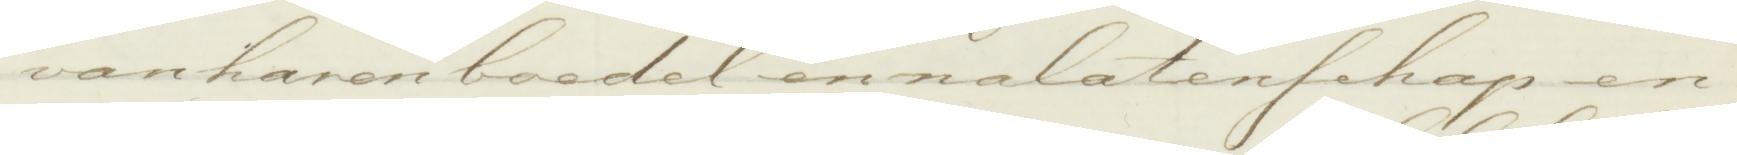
van haren boedel en nalatenschap en
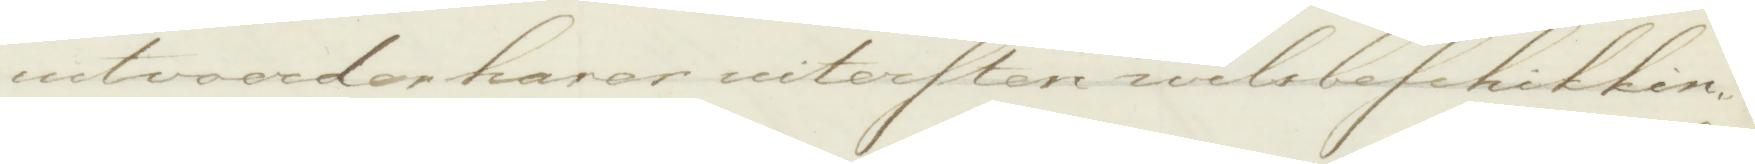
uitvoerder harer uitersten wilsbeschikkin„
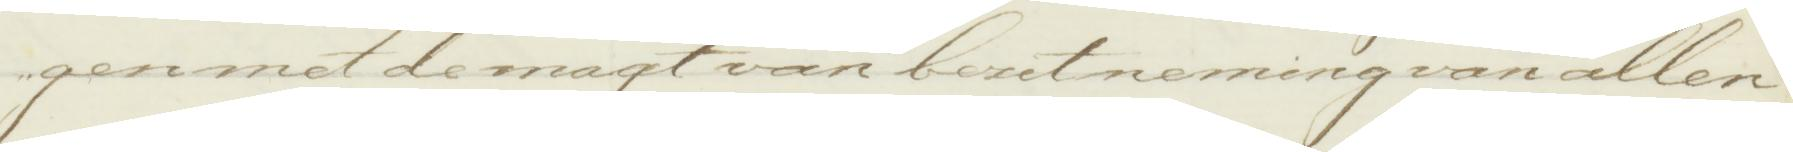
„gen met de magt van bezitneming van allen
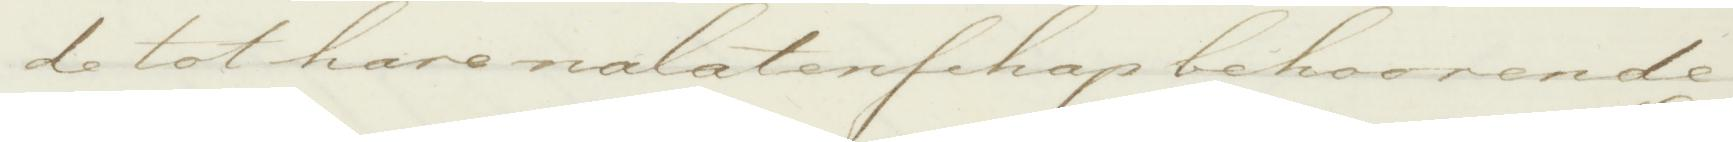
de tot hare nalatenschap behoorende
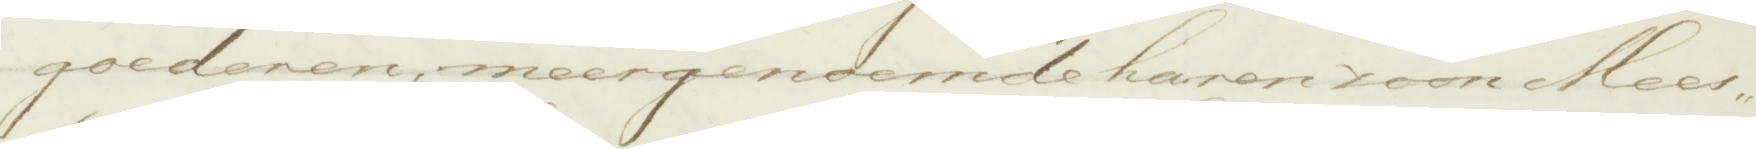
goederen, meergenoemde haren zoon Mees„
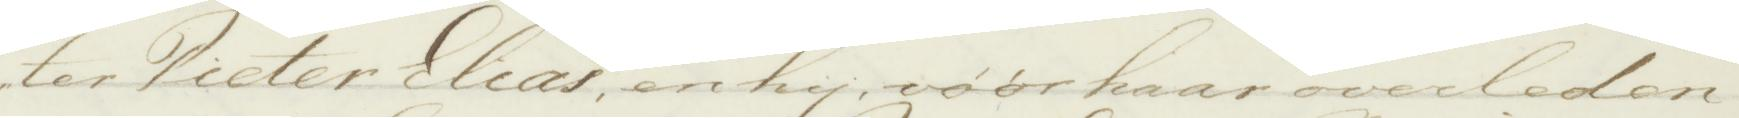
ter Pieter Elias, en hij, vóór haar overleden
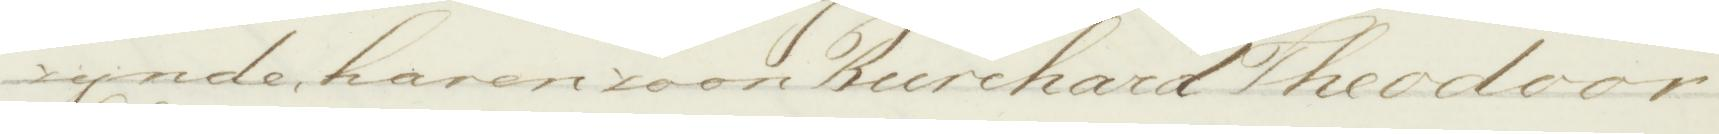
zijnde, haren zoon Burchard Theodoor
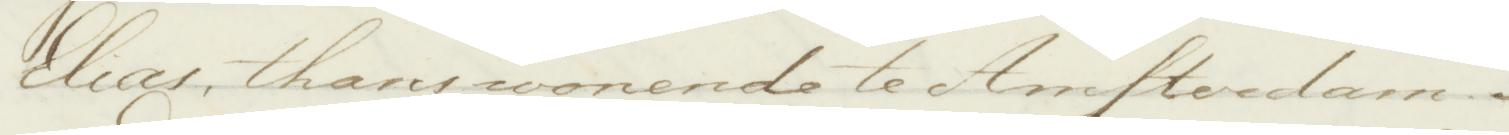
Elias, thans wonende te Amsterdam. —
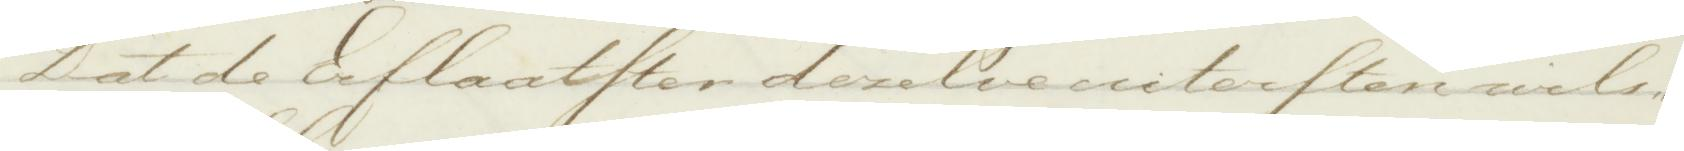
Dat de Erflaatster dezelve uitersten wils„
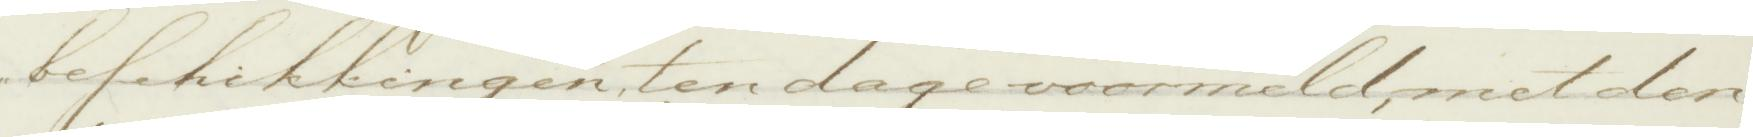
„beschikkingen, ten dage voormeld, met den
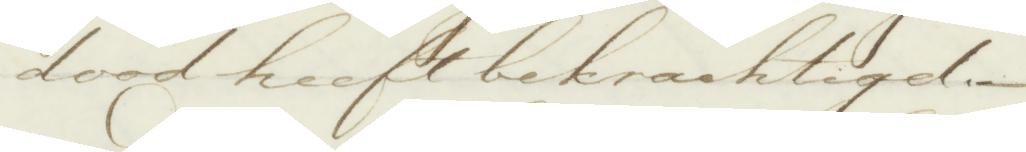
dood heeft bekrachtigd. —
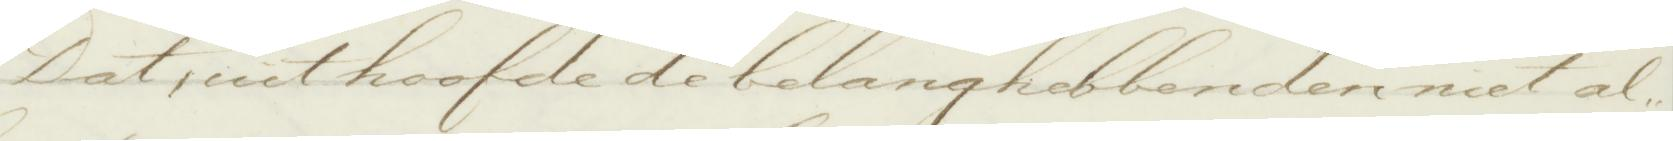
Dat, uit hoofde de belang hebbenden niet al„
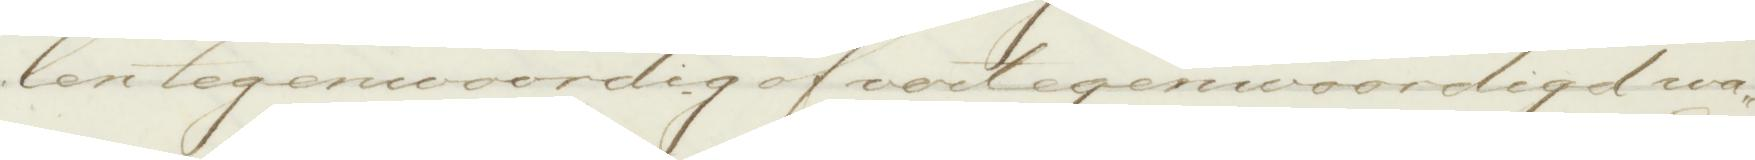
„len tegenwoordig of vertegenwoordigd wa„
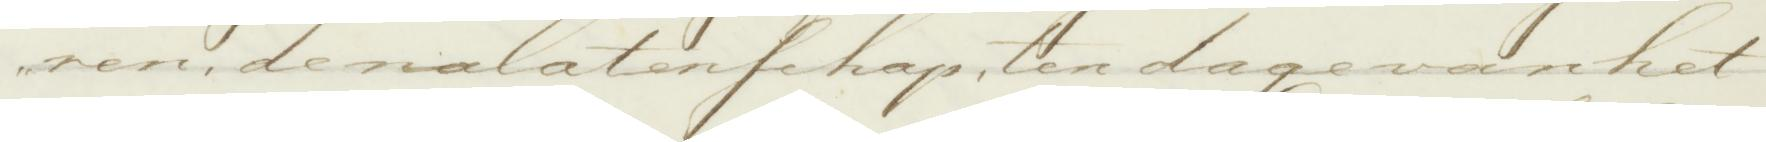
„ren, de nalatenschap, ten dage van het
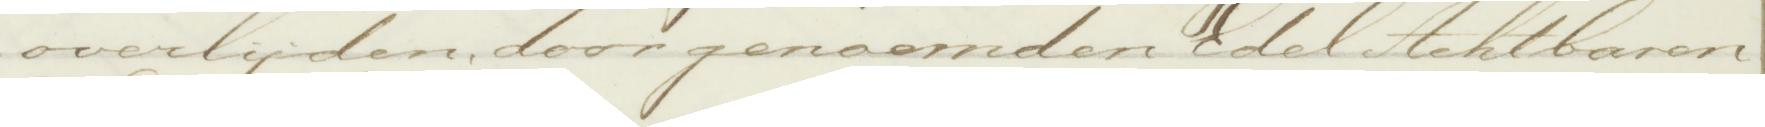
overlijden, door genoemden Edel Achtbaren
